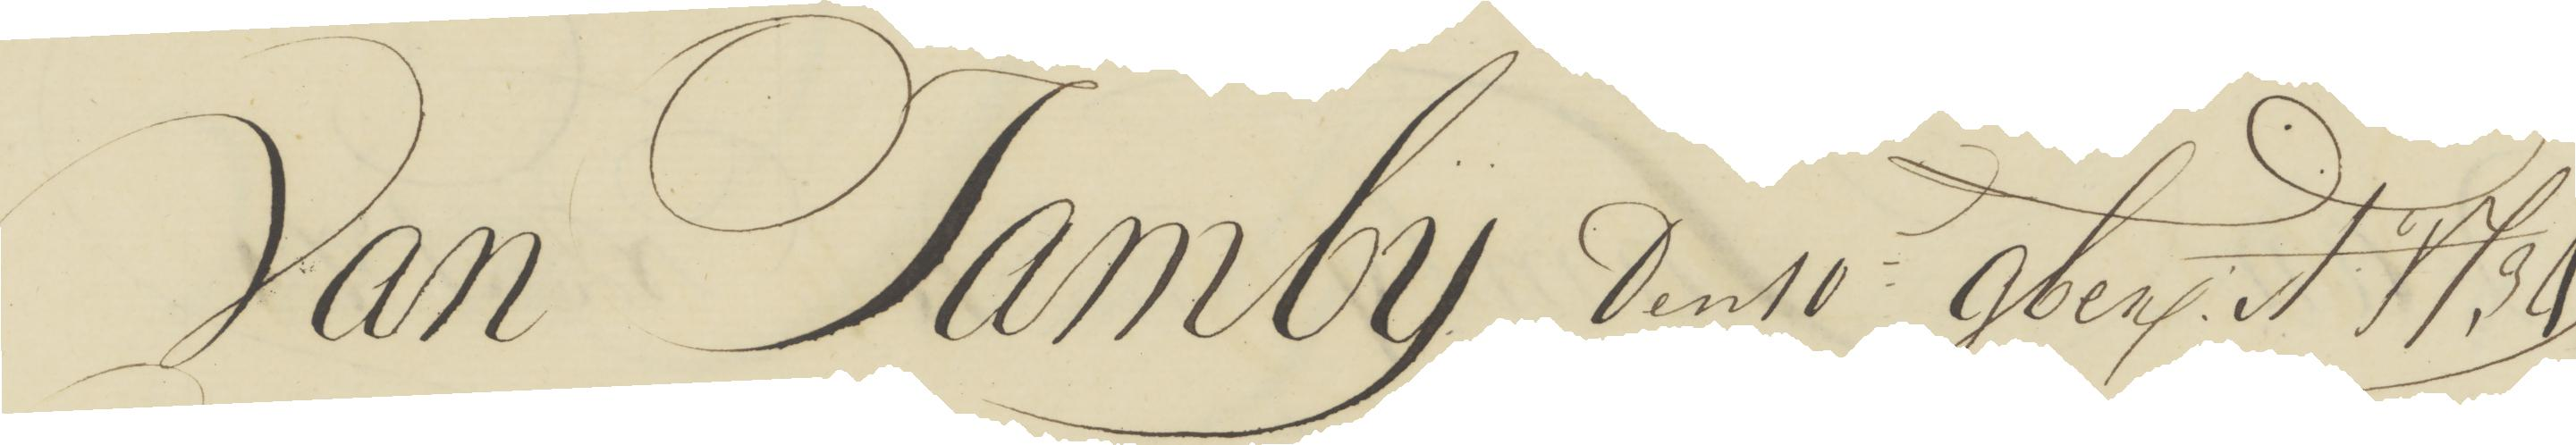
Van Jambij den 10: 9bers" Ao 1734
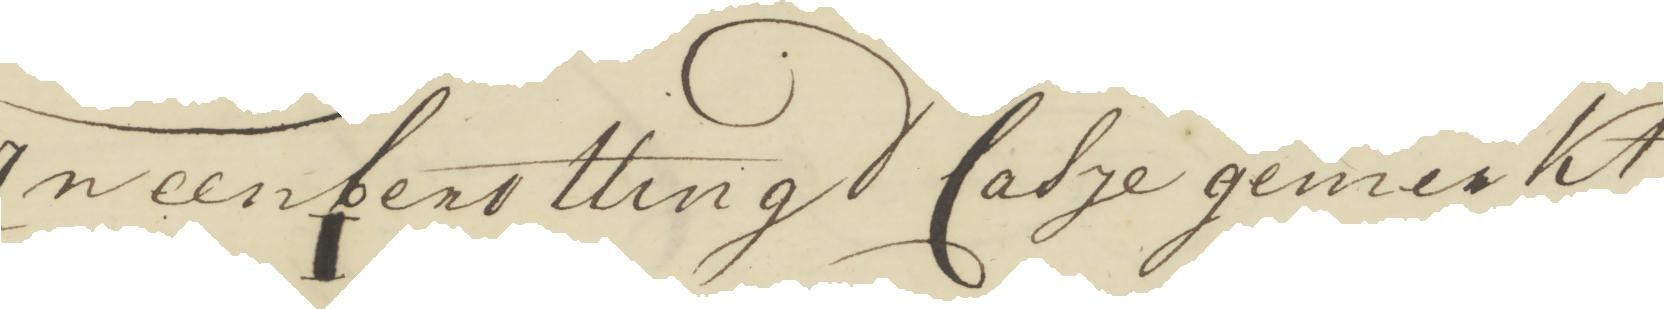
n een bezitting d Casje gemerkt
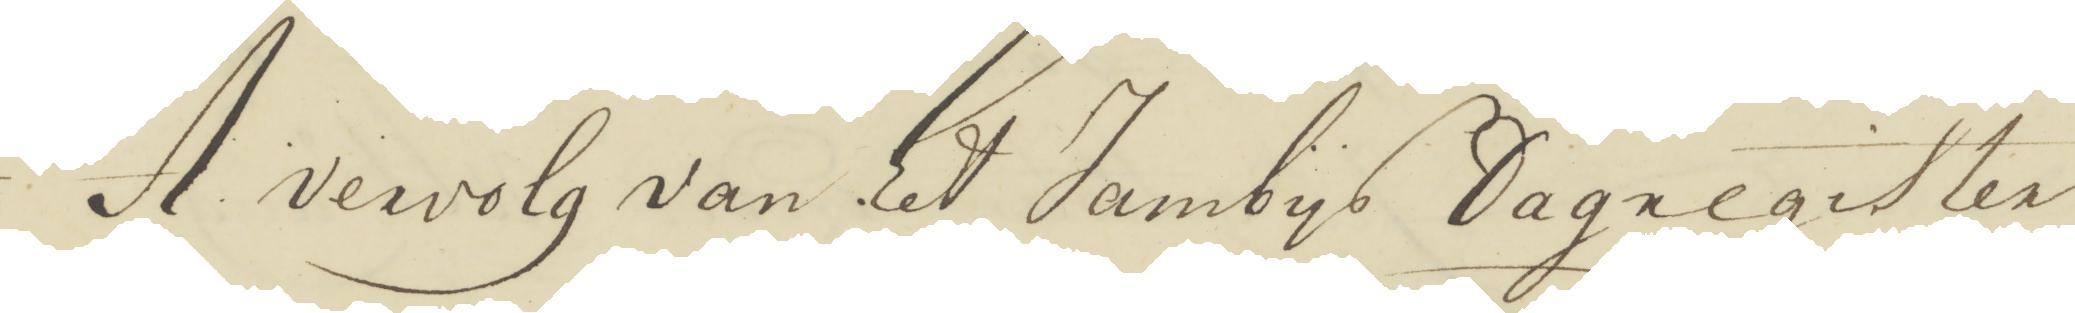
A. vervolg van het Jambijs dagregister
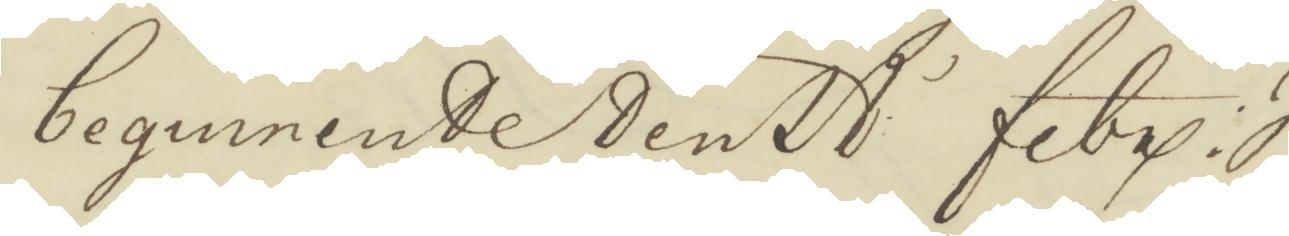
beginnende den 28': febrs:
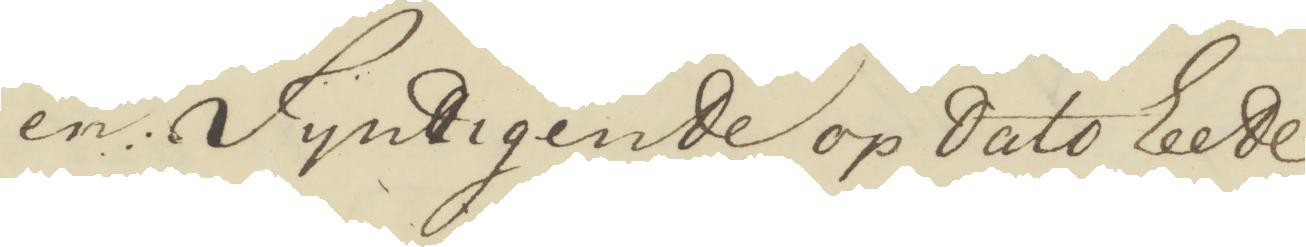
en Eijndigende op dato heede
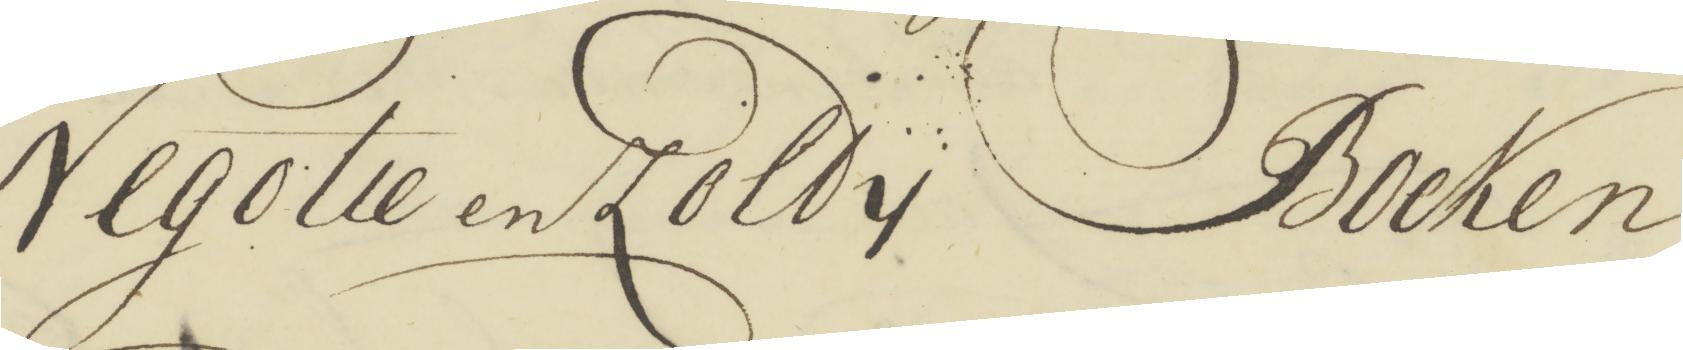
Negotie en Zoldij Boeken
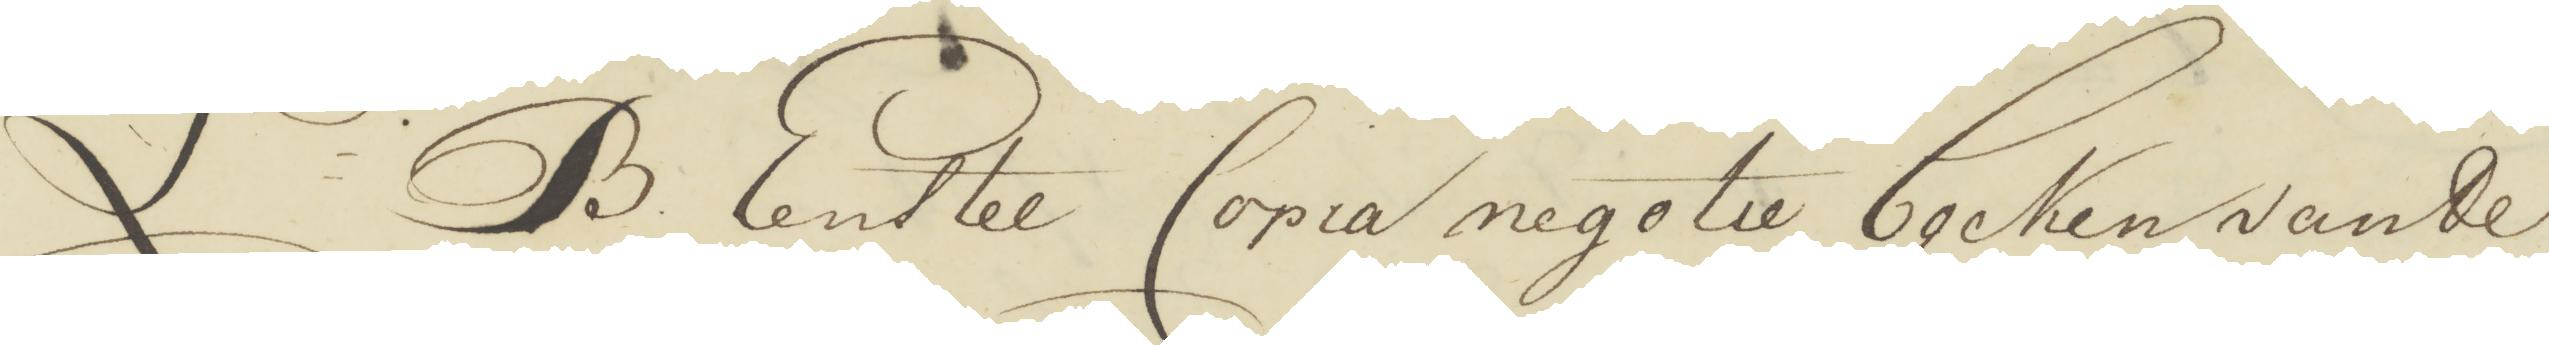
L=ra B. Een stel Copia negotie boeken van de
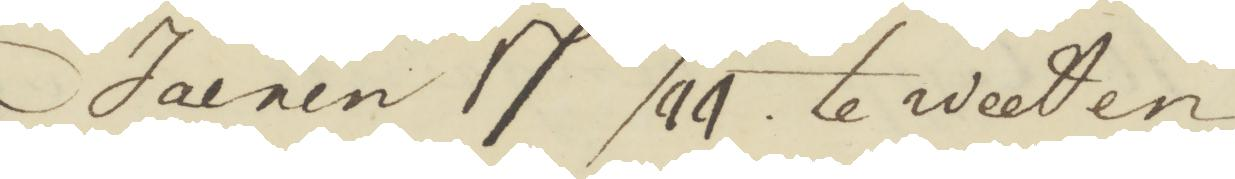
Jaeren 17 33/44. te weeten
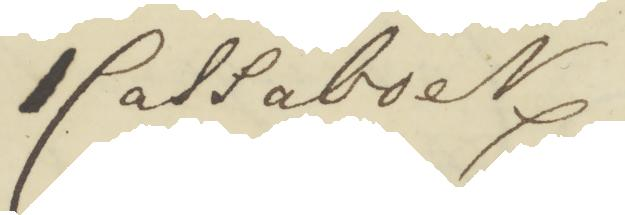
1 Cassaboek.
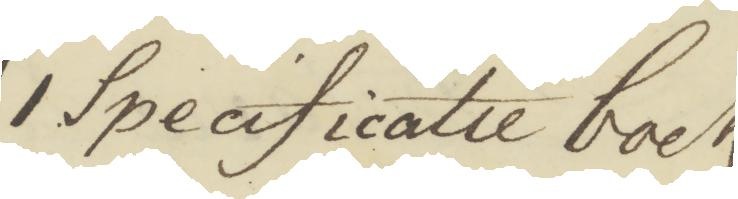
1. Specificatie boek
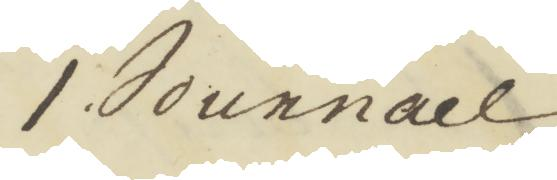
1. journael
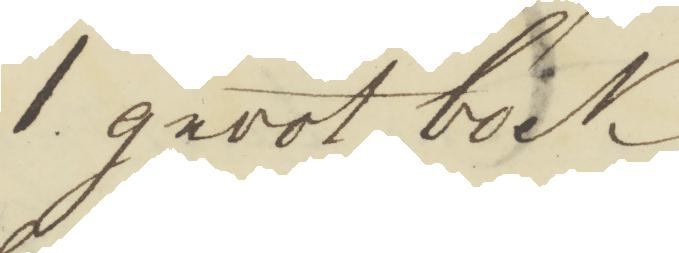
1. groot boek
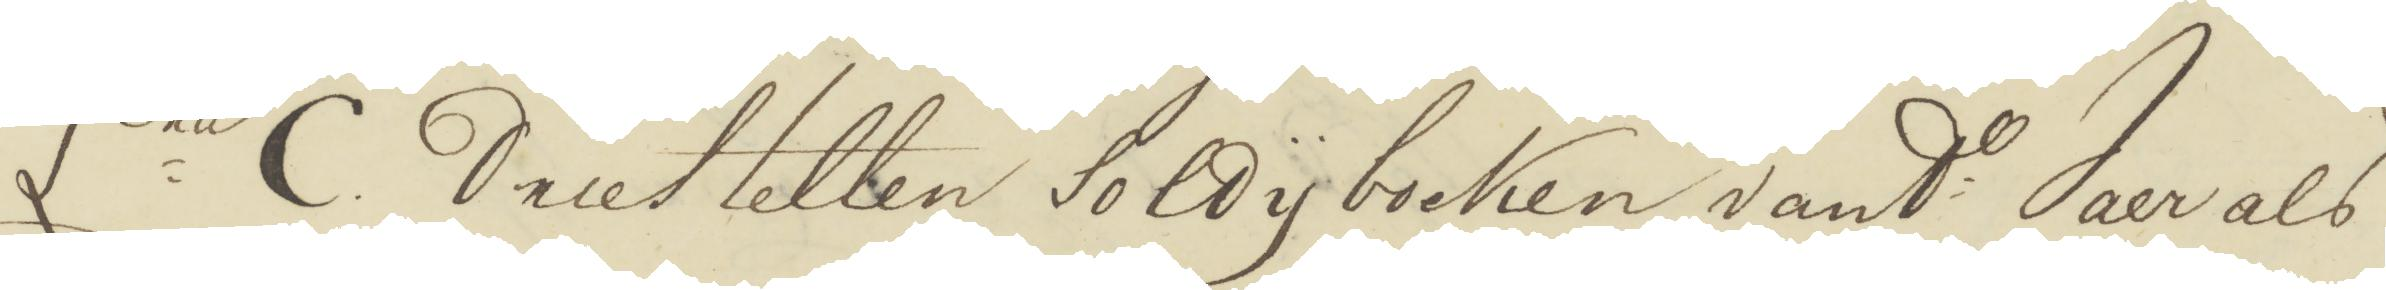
L=ra C. Driestellen soldijboeken van d=o jaer als
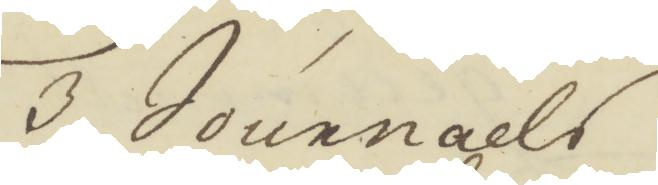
3. journaels
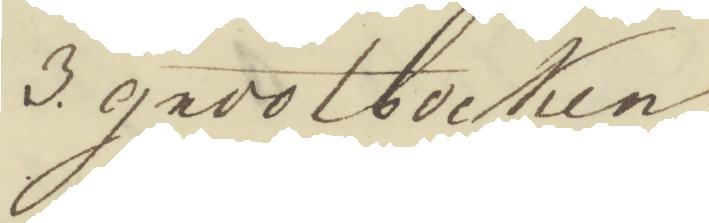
3. grootboeken
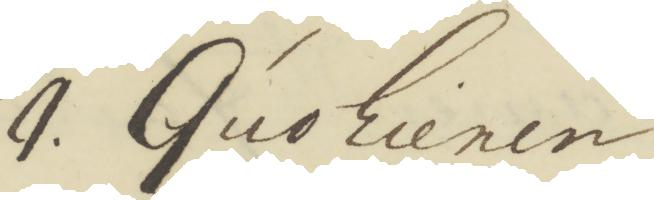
4. Quohieren
